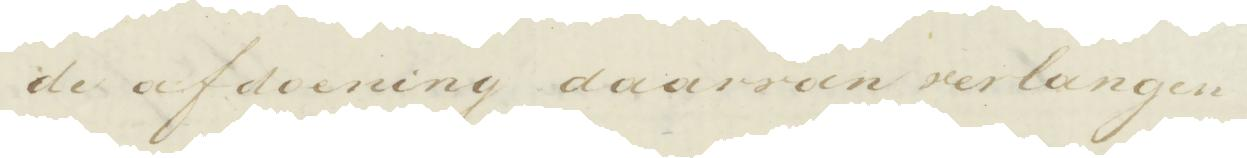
de afdoening daarvan verlangen
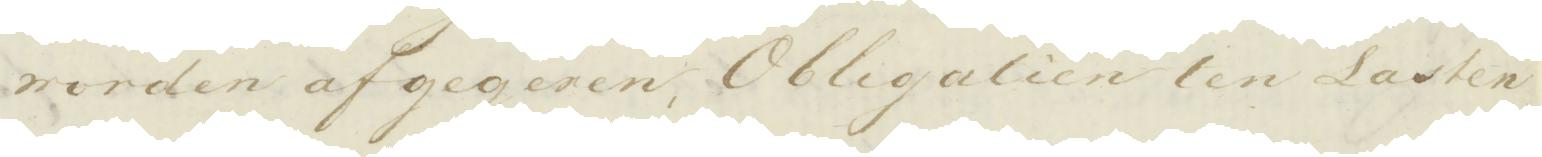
worden afgegeven, Obligatien ten Lasten
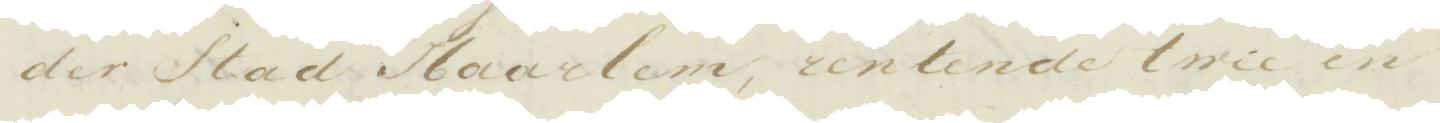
der Stad Haarlem, rentende twee en
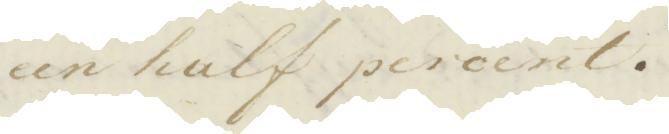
een half percent.
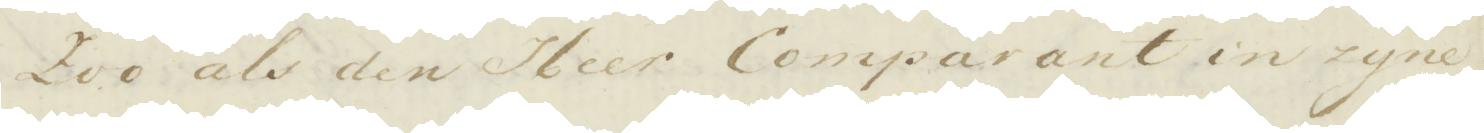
Zoo als den Heer Comparant in zyne
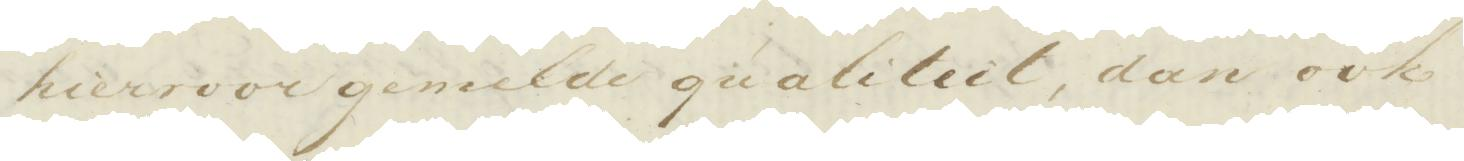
hiervoor gemelde qualiteit, dan ook
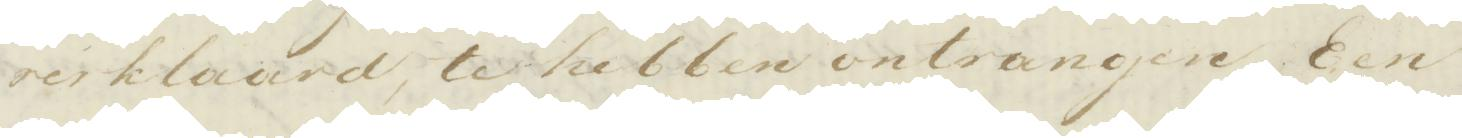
verklaard, te hebben ontvangen, Een
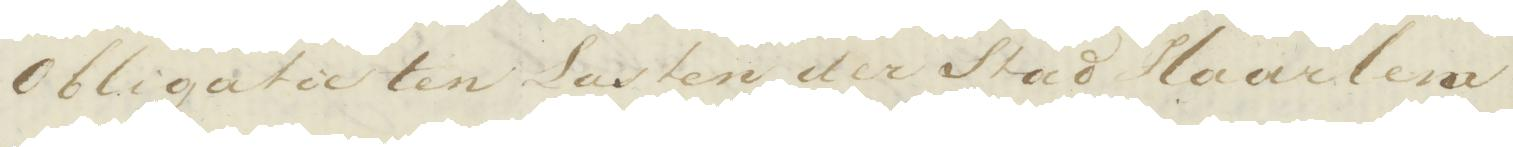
obligatie ten Lasten der Stad Haarlem
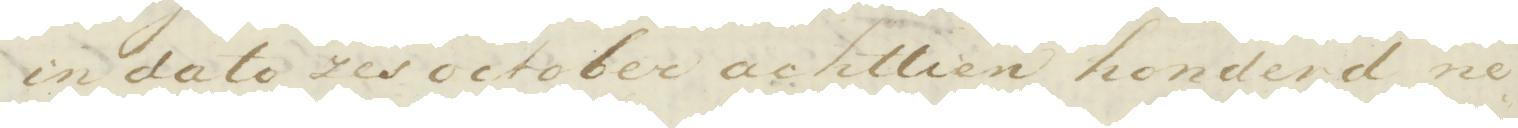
in dato zes october achttien honderd ne„
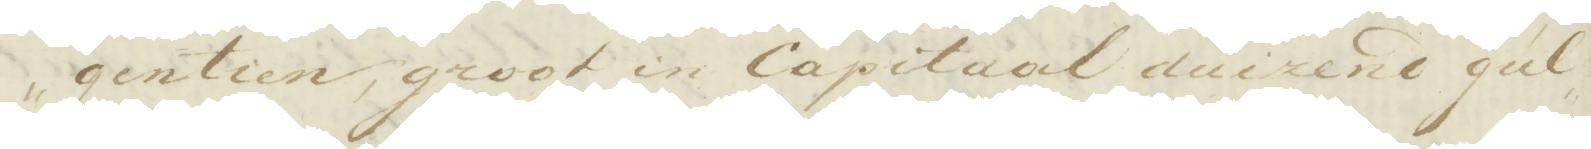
„gentien, groot in Capitaal duizend gul„
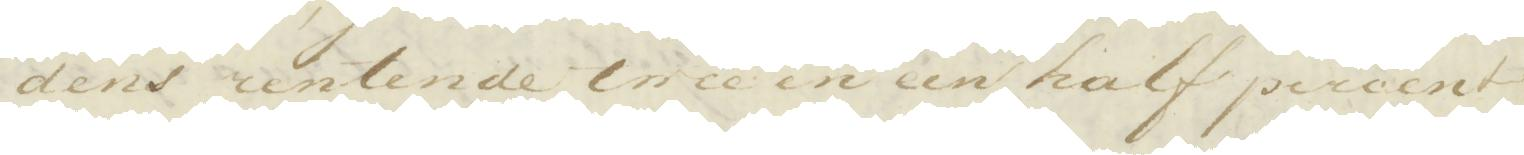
dens rentende twee en een half percent
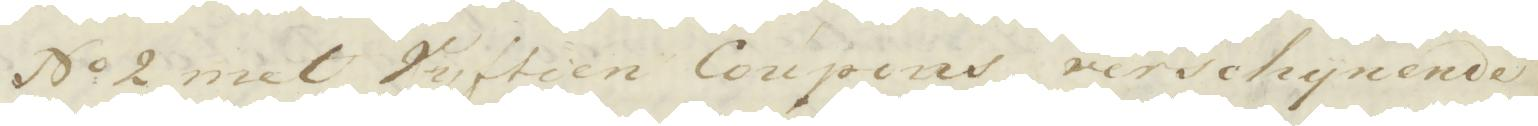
N:o 2, met Vyftien Coupons, verschijnende
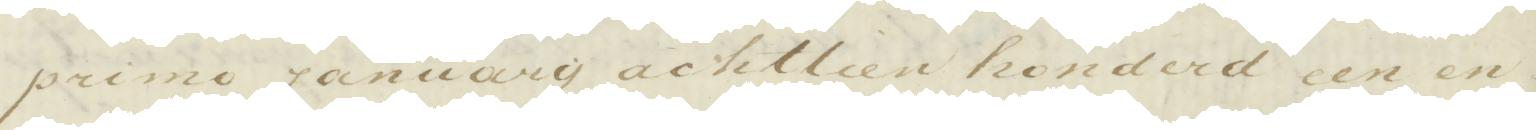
primo januarij achttien honderd een en
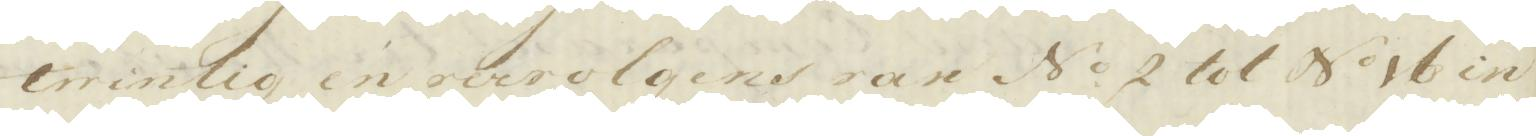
twintig en vervolgens van N„o 2 tot No 16 in
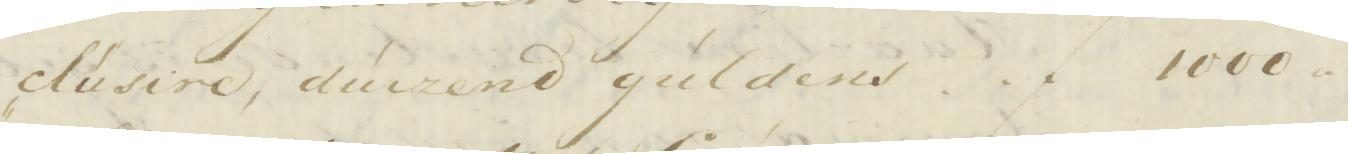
„clusive, duizend guldens . . ƒ 1000 „
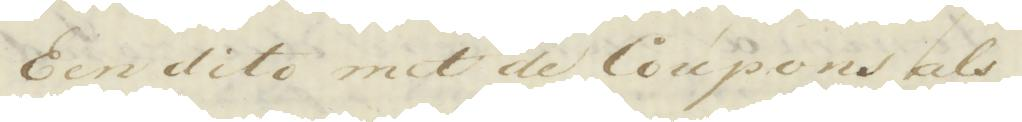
Een dito met de Coupons als
